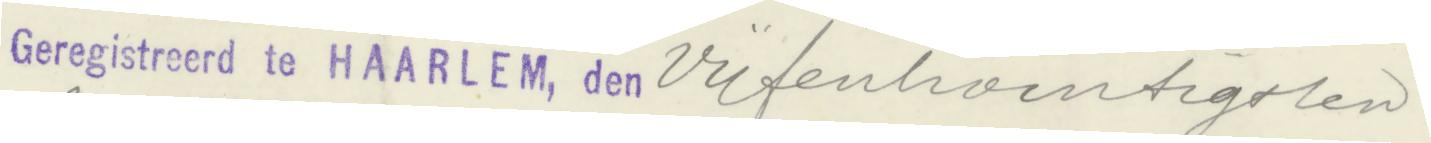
Geregistreerd te HAARLEM, den vijfentwintigsten
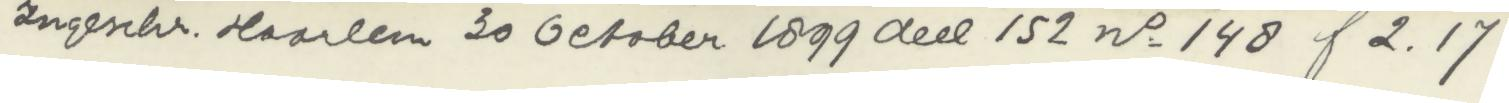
Ingeschr. Haarlem 30 october 1899 deel 152 n=o 148 ƒ 2.17
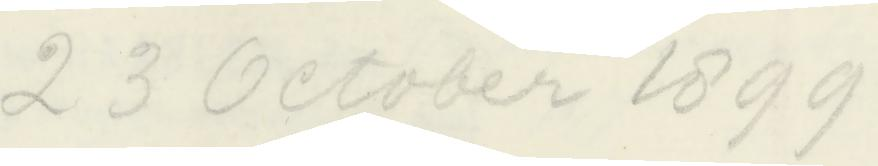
23 October 1899
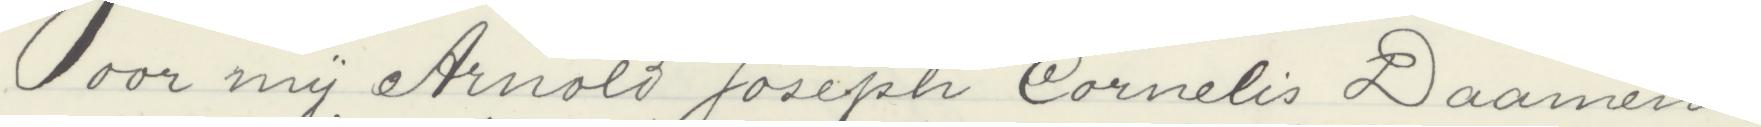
Voor mij Arnold Joseph Cornelis Daamen
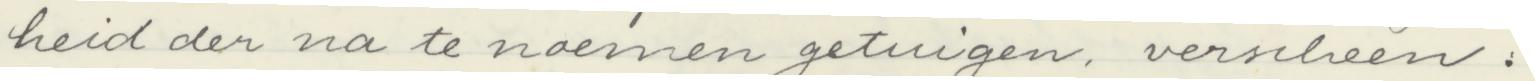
heid der na te noemen getuigen, verscheen:
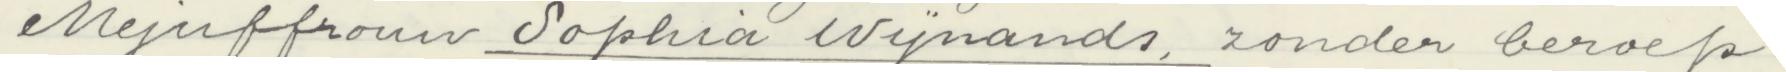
Mejuffrouw Sophia Wijnands, zonder beroep
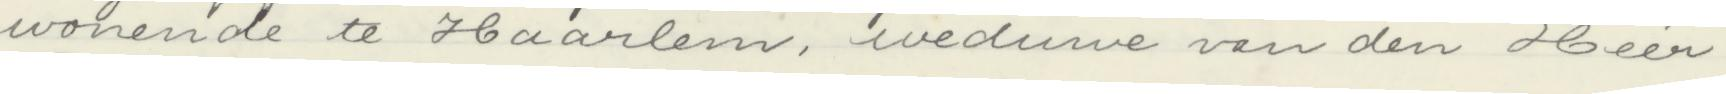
wonende te Haarlem, weduwe van den Heer
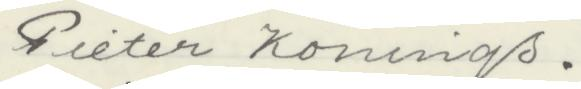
Pieter Konings.
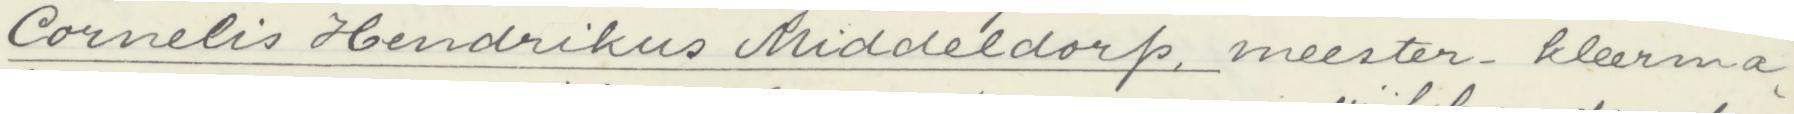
Cornelis Hendrikus Middeldorp, meester- kleerma
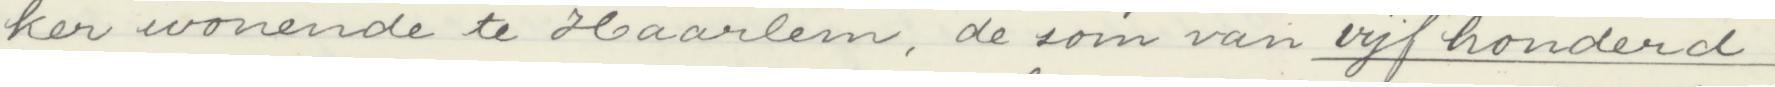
ker wonende te Haarlem, de som van vijf honderd
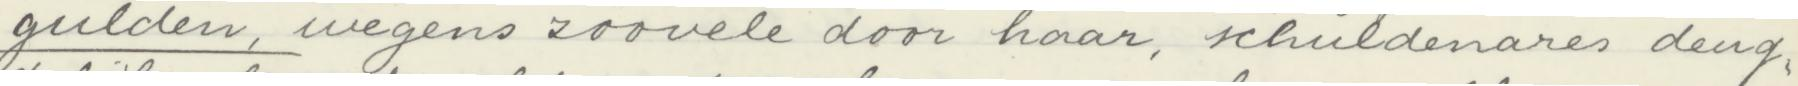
gulden, wegens zoovele door haar, schuldenares deug
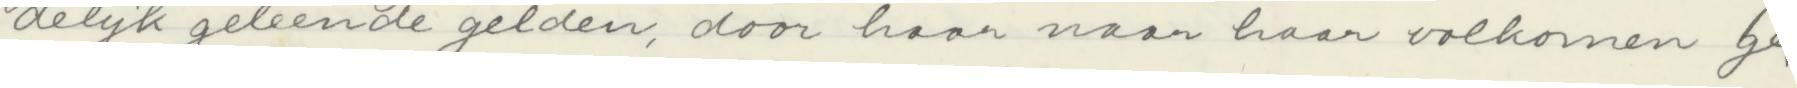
delijk geleende gelden, door haar naar haar volkomen ge
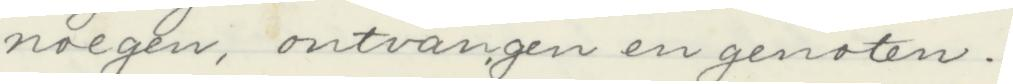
noegen, ontvangen en genoten.
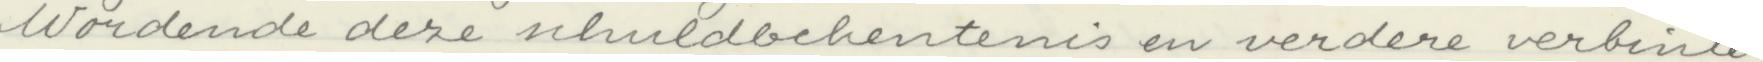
wordende deze schuldbekentenis en verdere verbinte
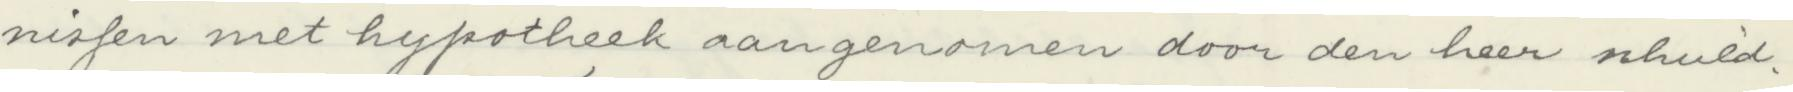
nissen met hypotheek aangenomen door den heer schuld„
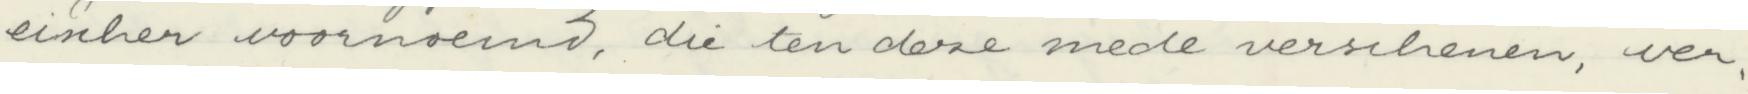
eischer voornoemd, die ten deze mede verschenen, ver
